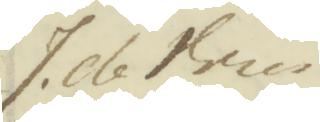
J. de Vries
